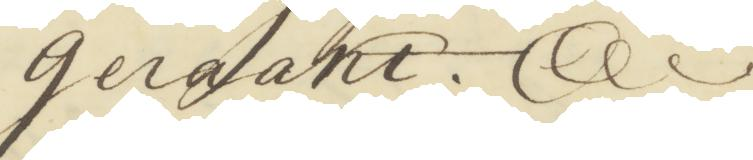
geraakt.
